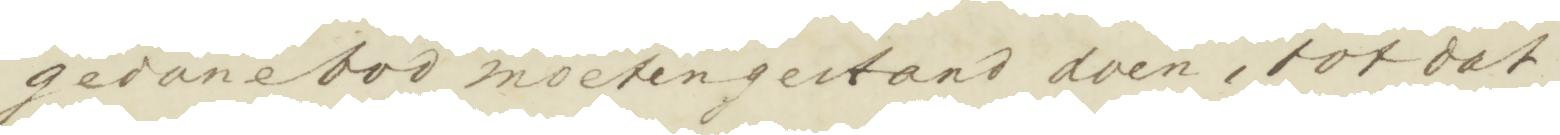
gedane bod moeten gestand doen, tot dat
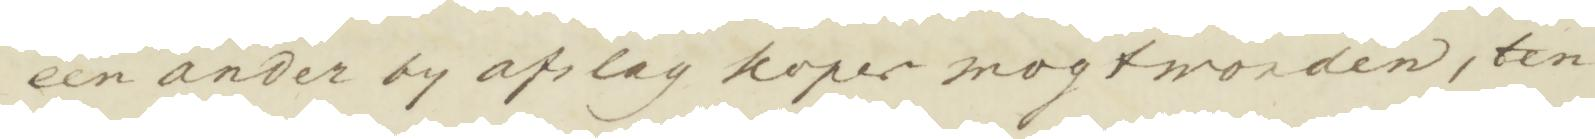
een ander by afslag koper mogt worden, ten
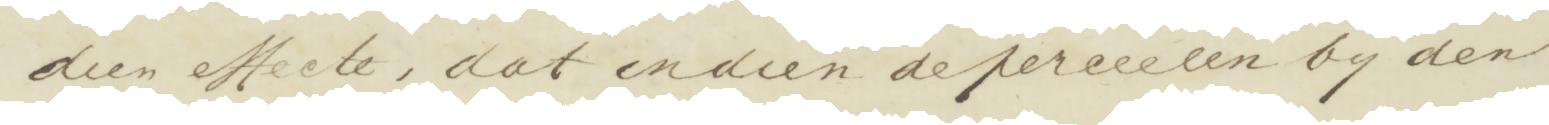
dien effecte, dat indien de perceelen by den
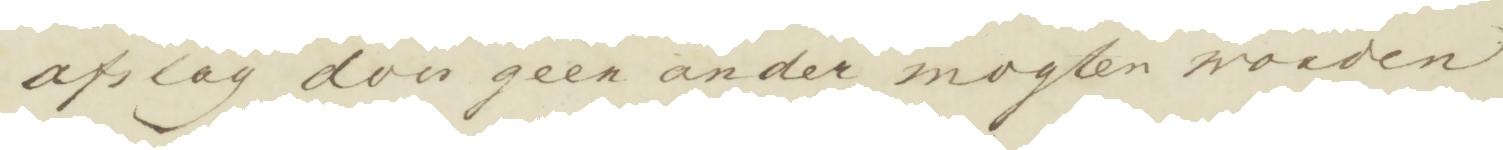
afslag door geen ander mogten worden
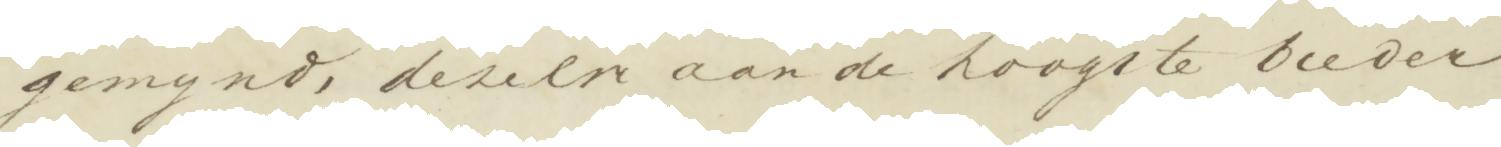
gemynd, dezelve aan de hoogste bieder
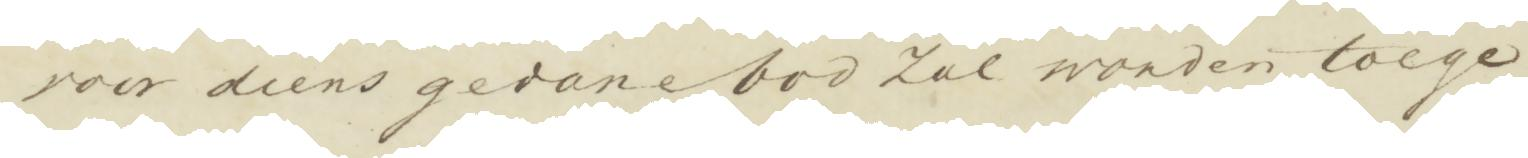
voor diens gedane bod zal worden toege
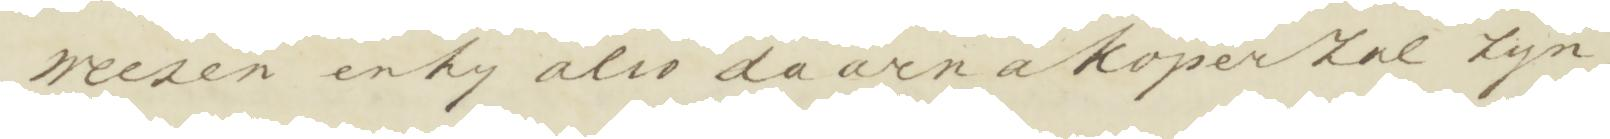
weezen en hy also daar na koper zal zyn,
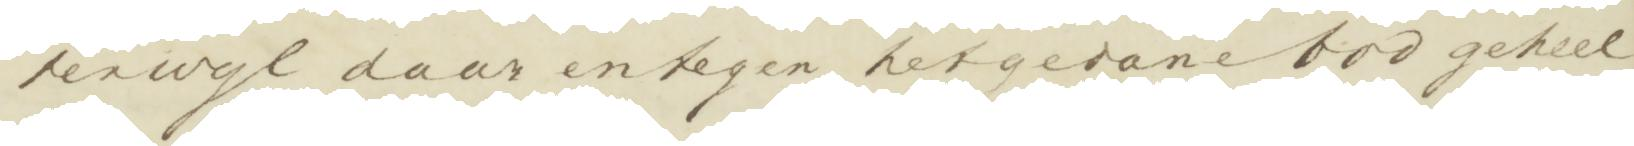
terwyl daar en tegen het gedane bod geheel
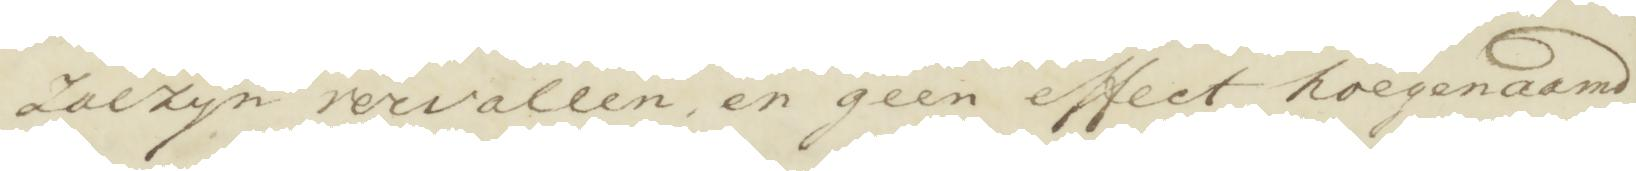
zal zijn vervallen, en geen effect hoegenaamd
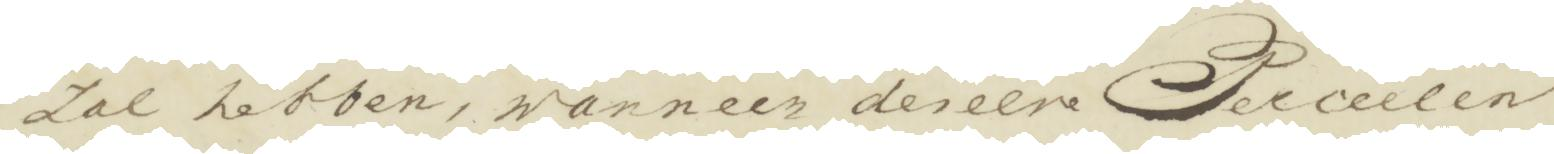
zal hebben, wanneer deselve Perceelen
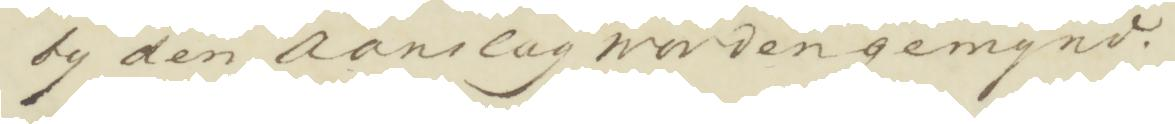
by den aanslag worden gemijnd.
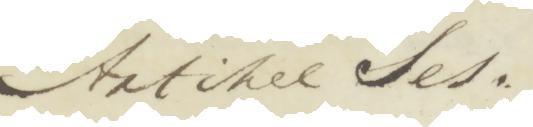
Artirkel Ses.
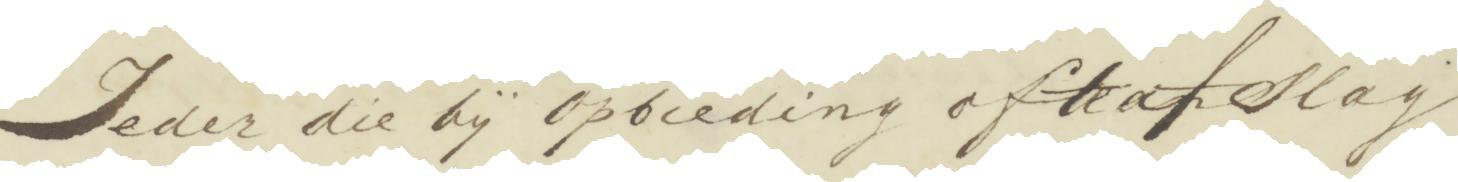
Ieder die bij opbieding ofte afslag
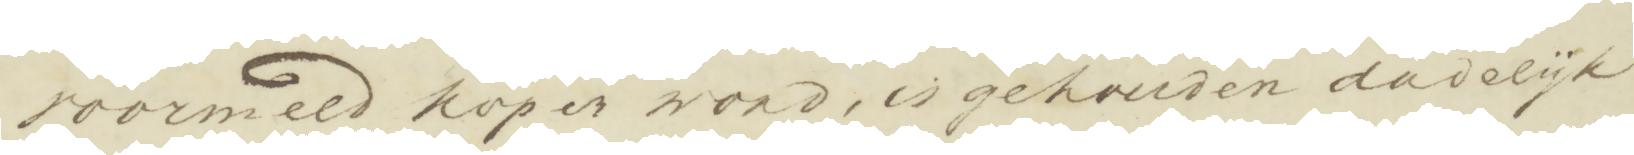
voormeld koper word, is gehouden dadelijk
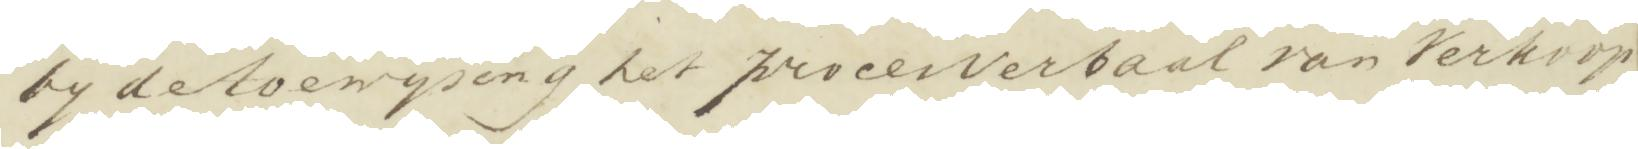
by de toewysing het procesverbaal van verkoop
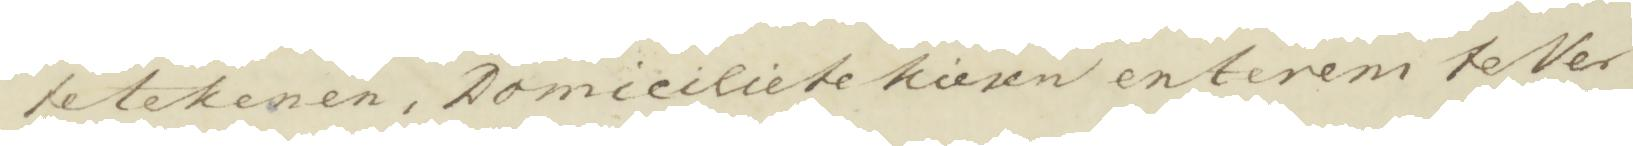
te tekenen, Domicilie te kiezen en tevens te Ver
